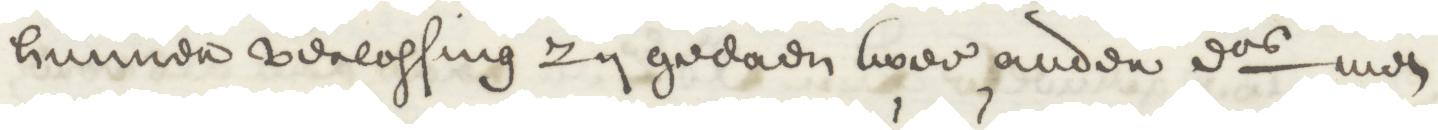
hunner verlossing zij gedaen twee ander d=os met
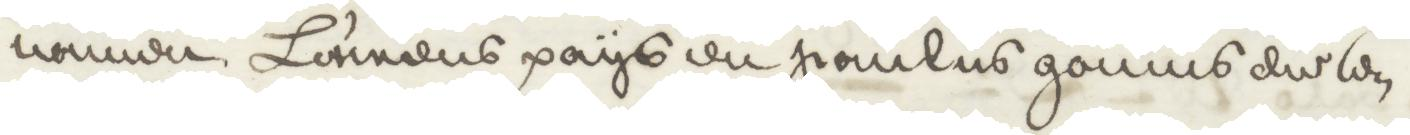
namen Laurens paijs en paulus gomus die ten
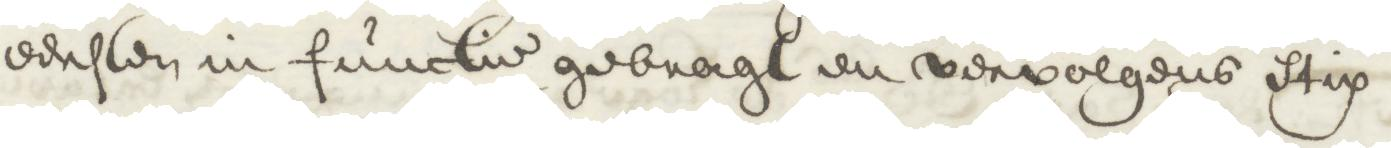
eersten in functie gebragt en vervolgens stip
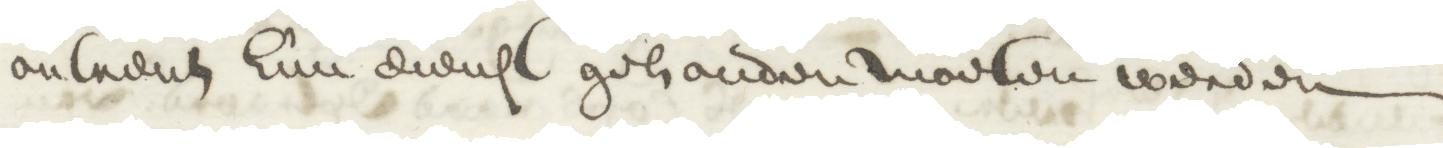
ontrent hun dienst gehouden moeten werden
